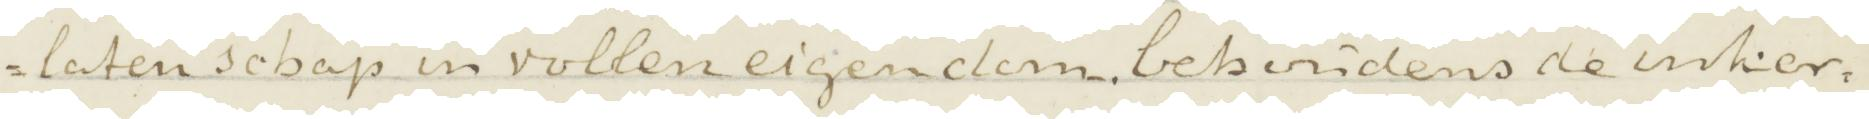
=latenschap in vollen eigendom, behoudens de inkor-
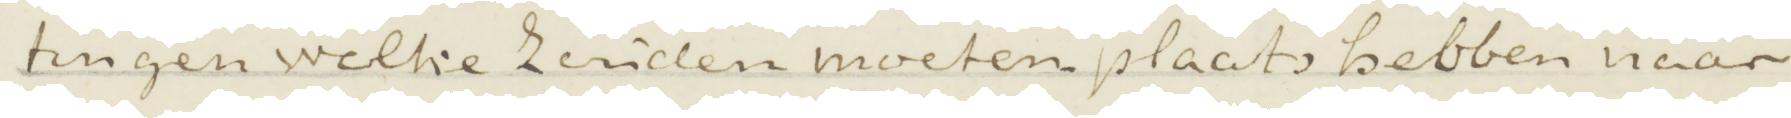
tingen welke Zouden moeten plaats hebben naar
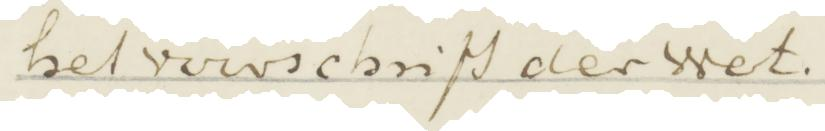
het voorschrift der Wet.
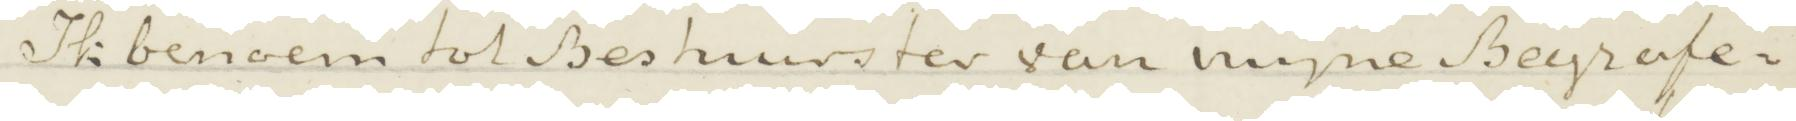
Ik benoem tot Bestuurster van mijne Begrafe=
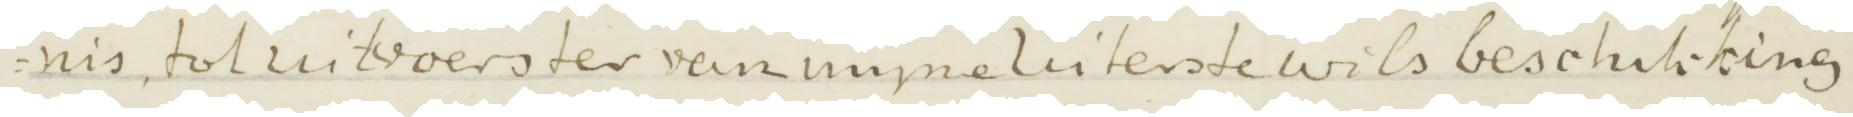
„nis tot uitvoerster van mijne Uiterste wilsbeschikking
